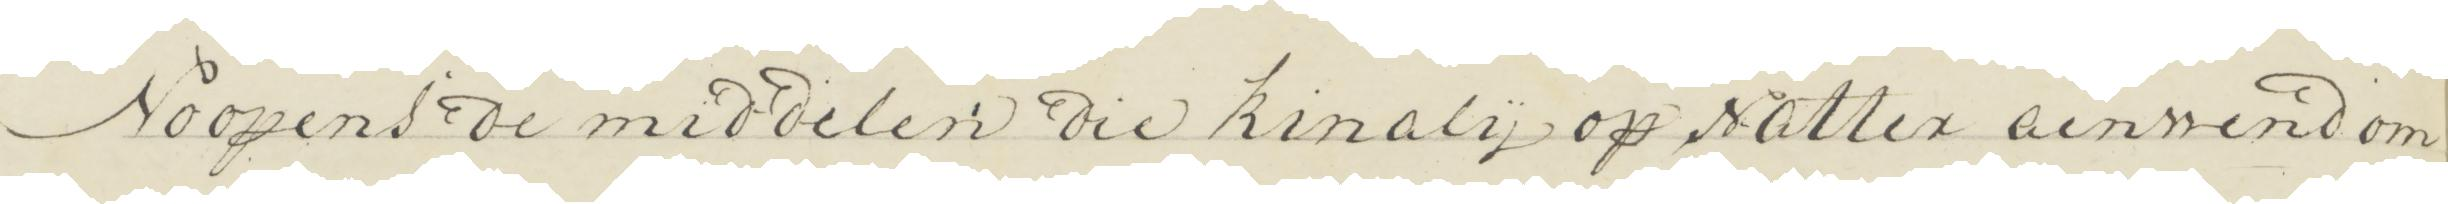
Noopens de middelen die kinalij op Natter aenwend om
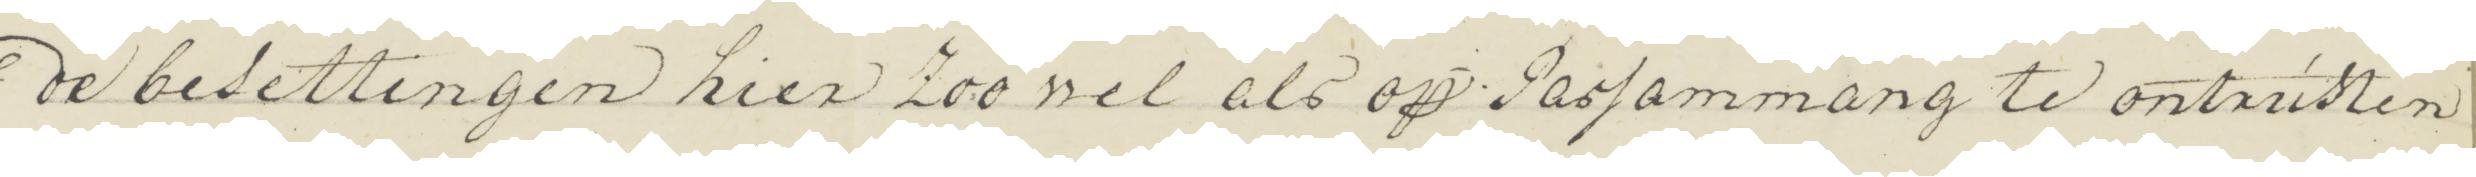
de besettingen hier zoo wel als op Passammang te ontrusten
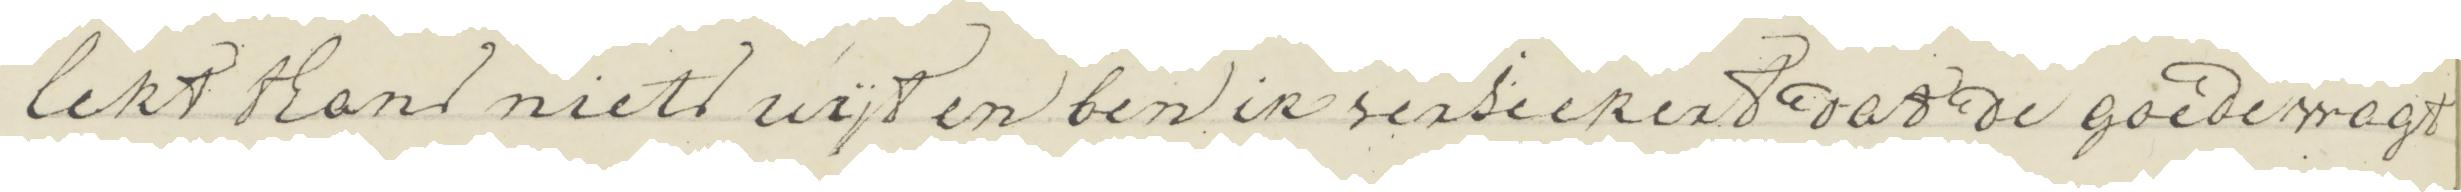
lekt thans niets uijt en ben ik verseekert dat de goede wagt
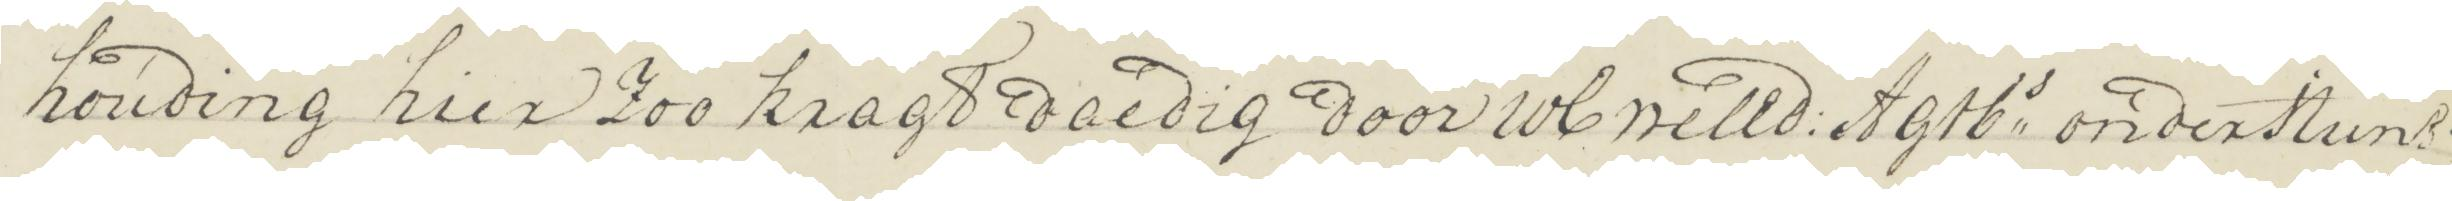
houding hier zoo kragt daedig door uE welld: Agtb„s onderstun
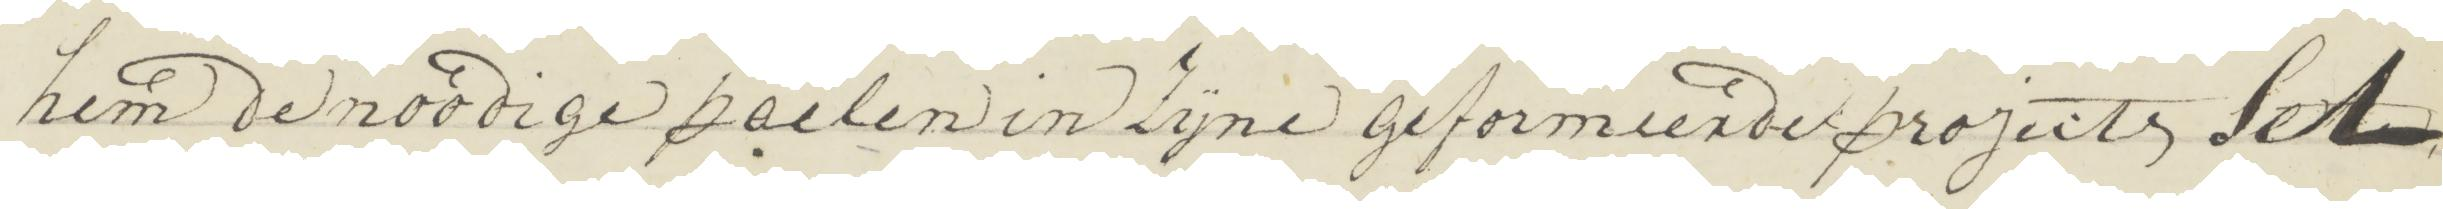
hem de noodige paelen in zijne geformeerde projecten set
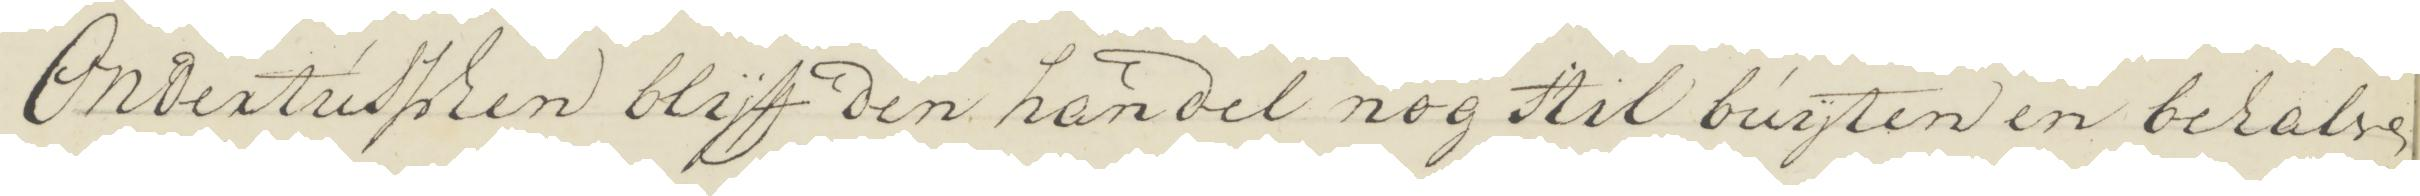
Ondertusschen blijft den handel nog stil buijten en behalven
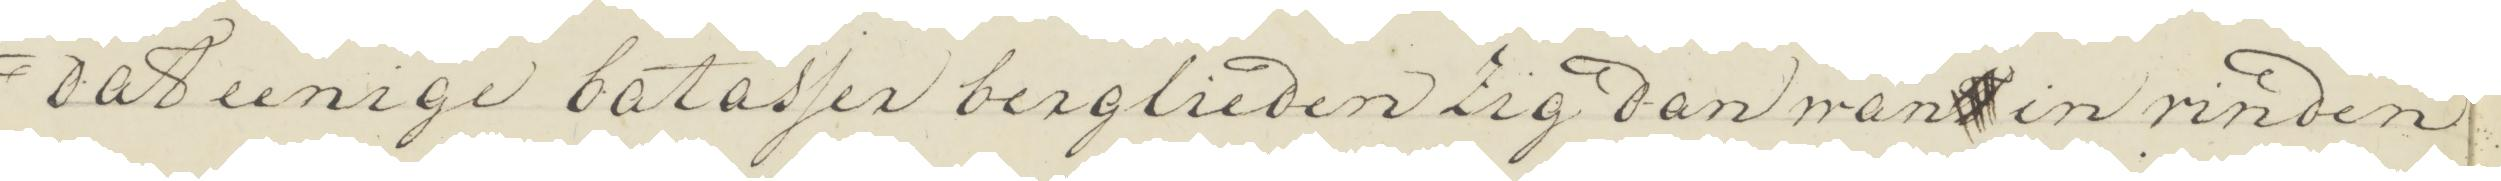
dat eenige batasser berglieden zig dan wanz in vinden
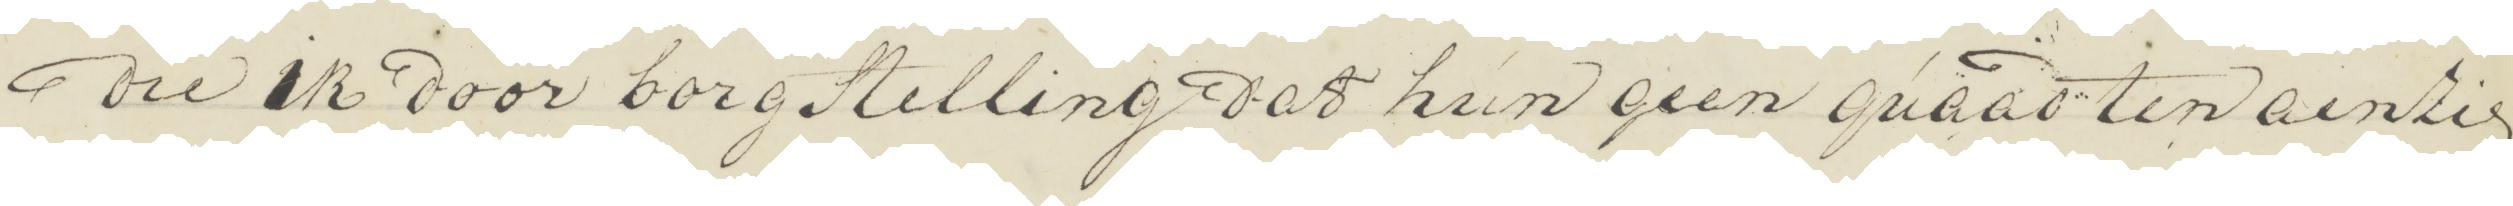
die ik door borgstelling dat hun geen quaad ten aenzie
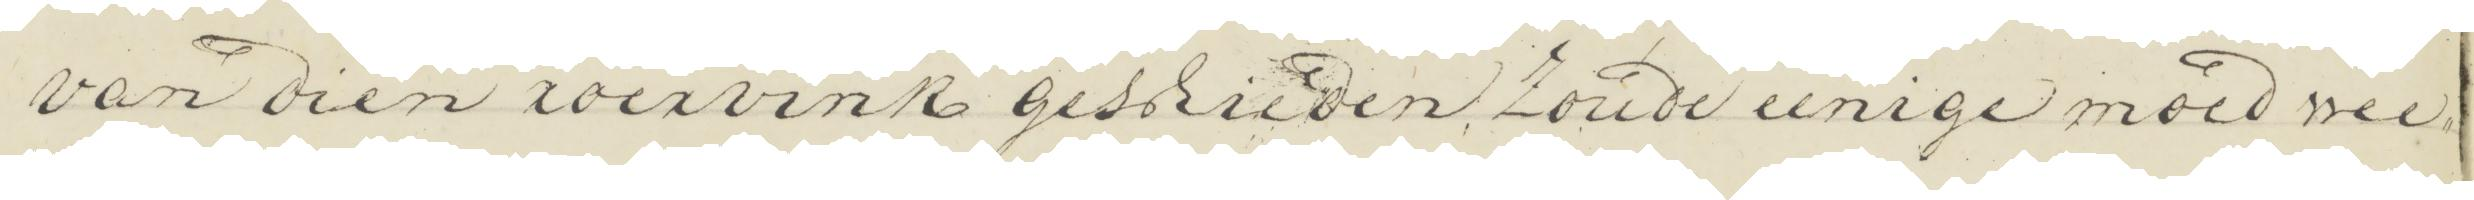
van dien roervink geschieden zoude eenige moed wee„
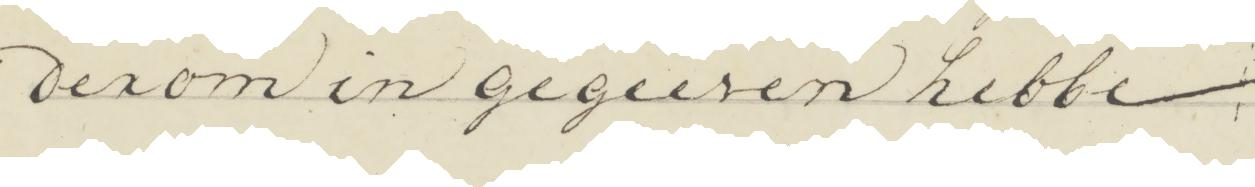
derom in gegeeven hebbe
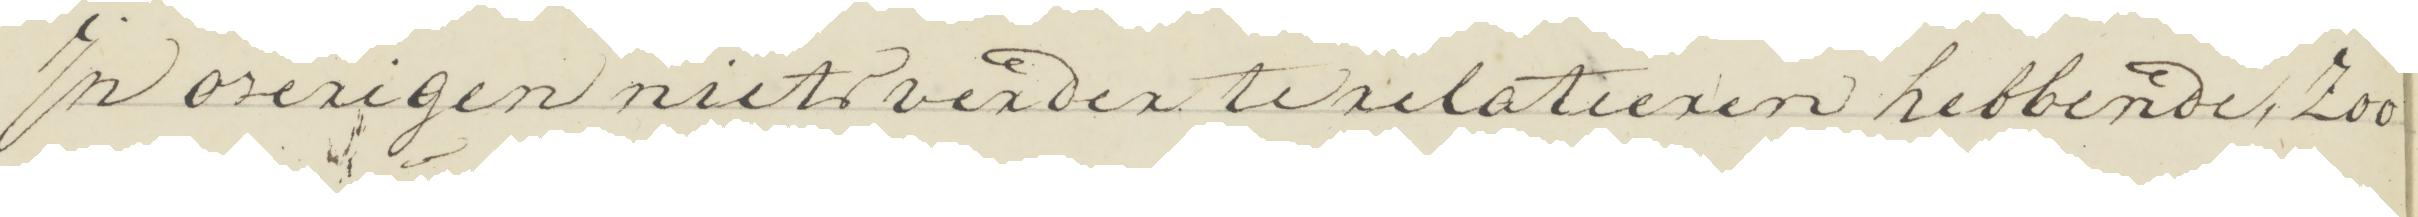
Jn overigen niets verder te relatieren hebbende, zoo
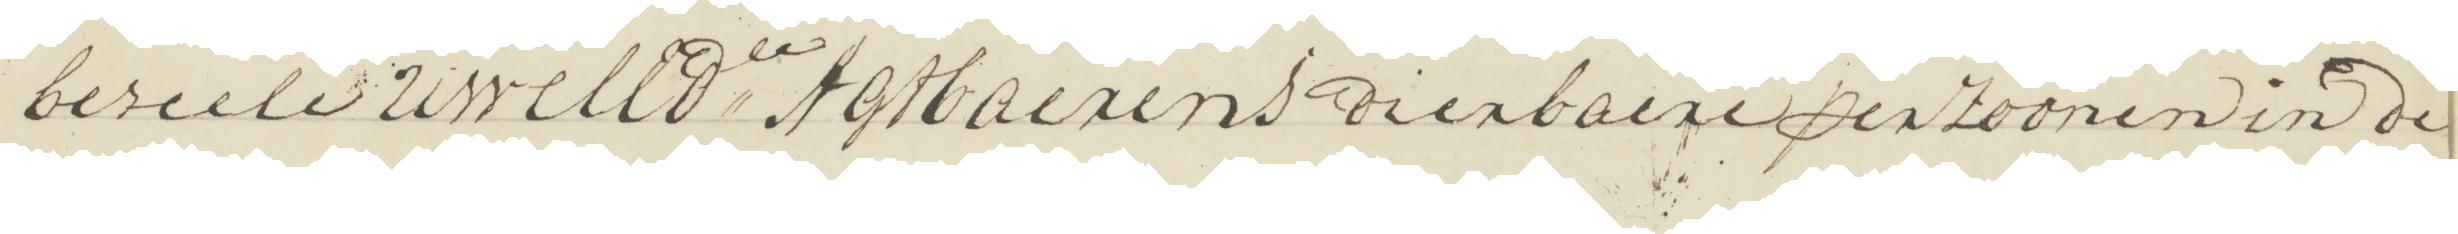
beveele uwelEd„er Agtbaerens dierbaere perzoonen in de
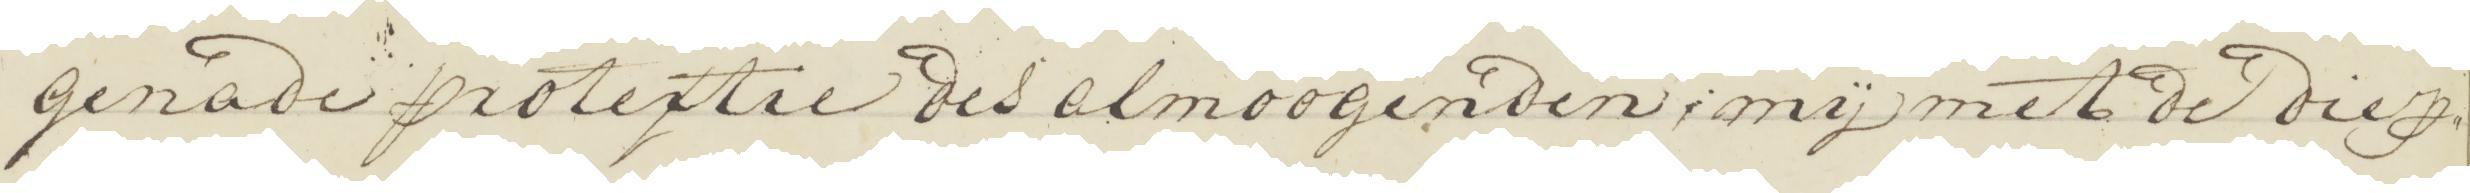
genade protectie des almoogenden; mij met de diep„
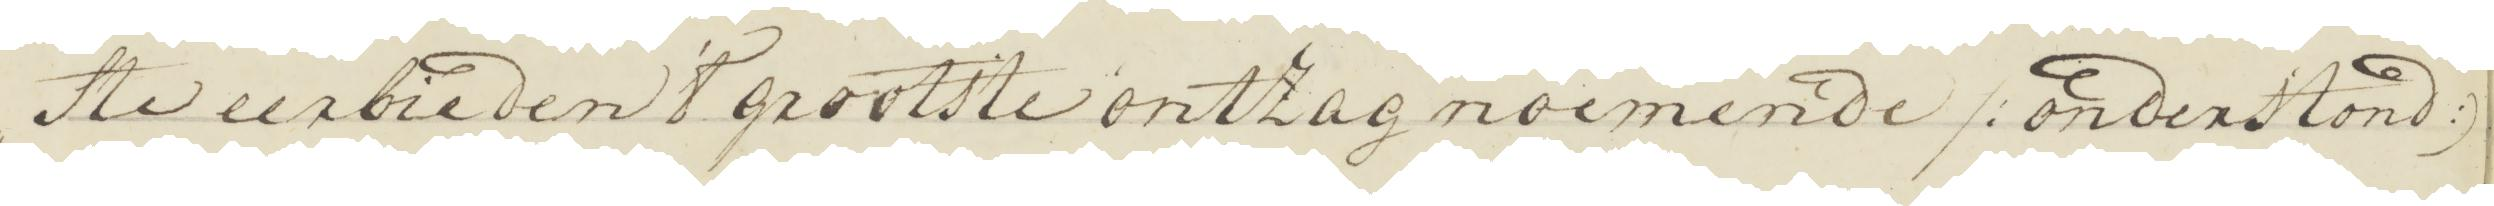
ste eerbied en ’t grootste ontzag noemende /:onderstond:/
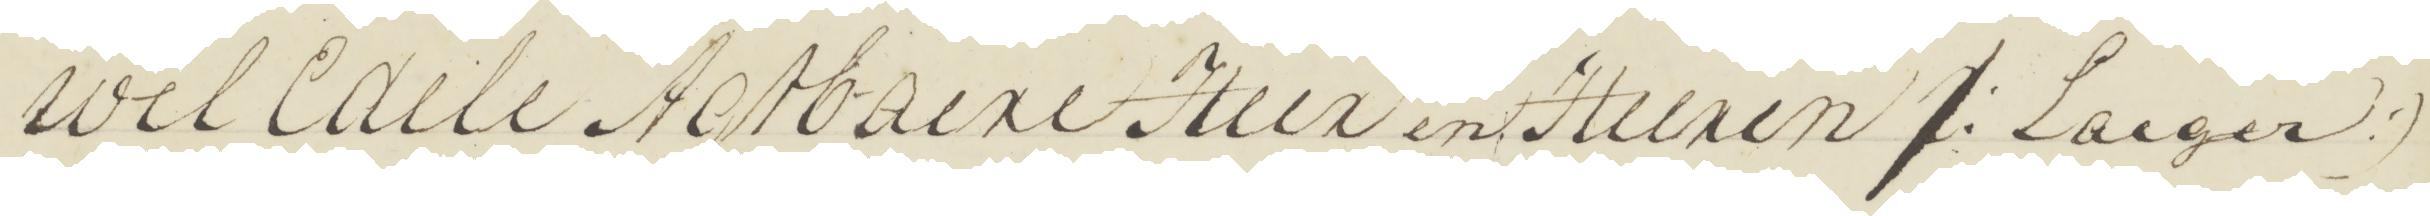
wel Edele Agtbaere Heer en Heeren /:Laeger:/
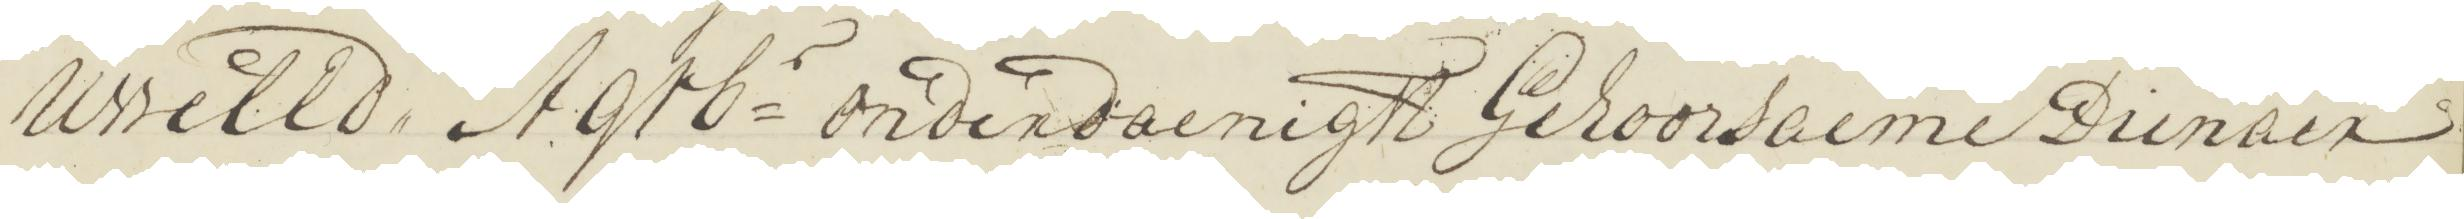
uwelEd„e Agtb=s onderdaenigh Gehoorsaeme Dienaer
